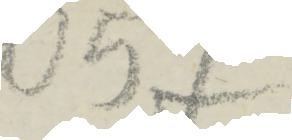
657
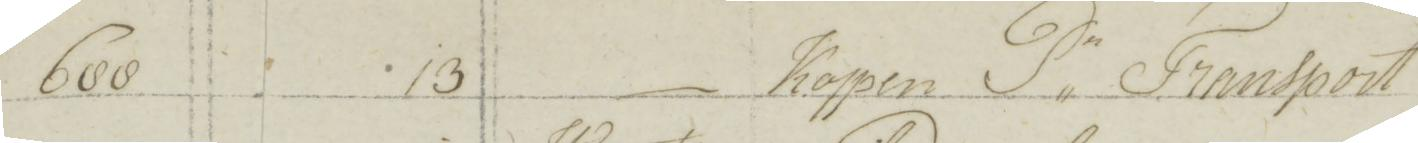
688 , 13 — Koppen P„r Transport
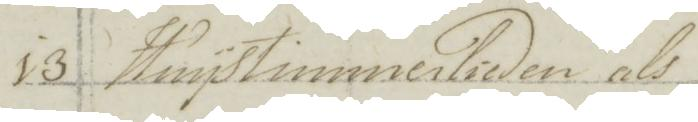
13 Huijstimmerlieden als
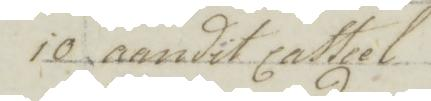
10. aan dit casteel
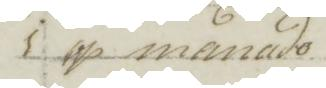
1 op manado
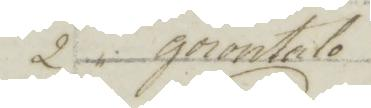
2 „. gorontalo
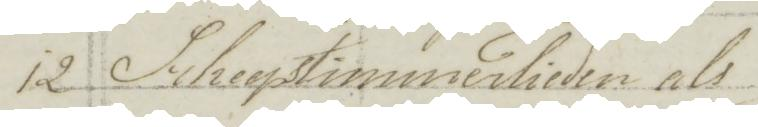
12 Scheepstimmerlieden als
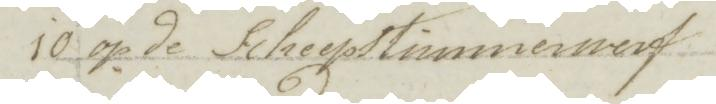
10 op de scheepstimmerwerf
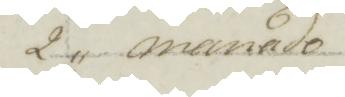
2 „ manado
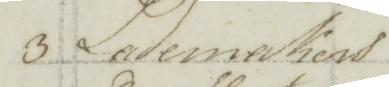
3 Lademakers
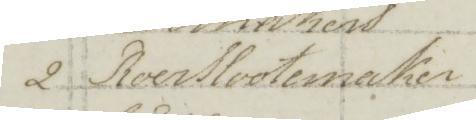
2 Roerslootemaker
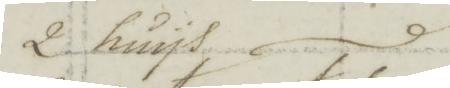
2. huijs _o
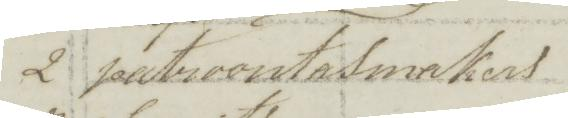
2 patroontasmakers
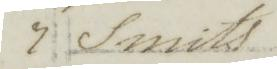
1 smits
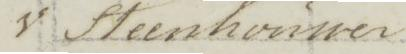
1 steenhouwer
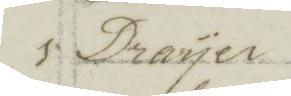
1 Draijer
